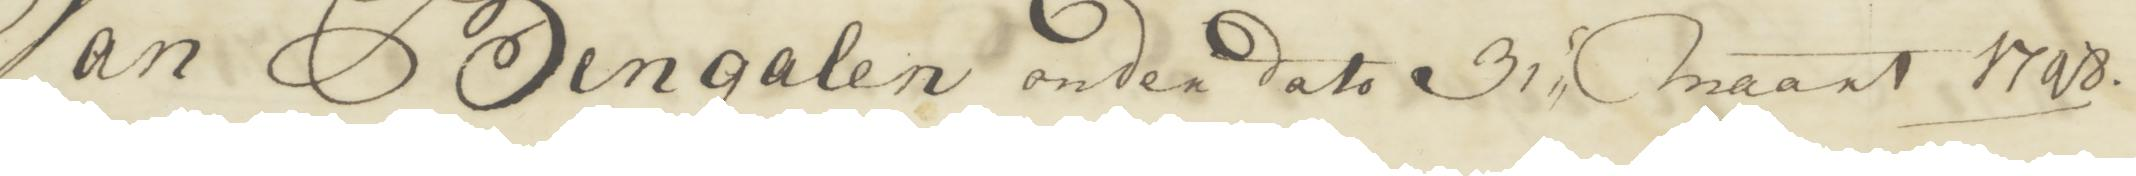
Van Bengalen onder dato 31„' Maart 1748.
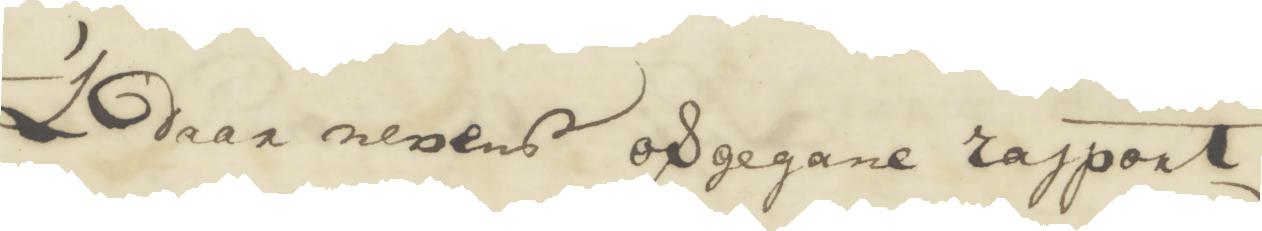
't daar nevens overgegane rapport
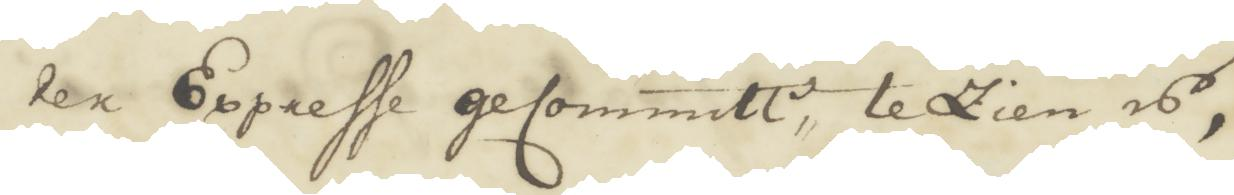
der Expresse gecommitt„s te zien is,
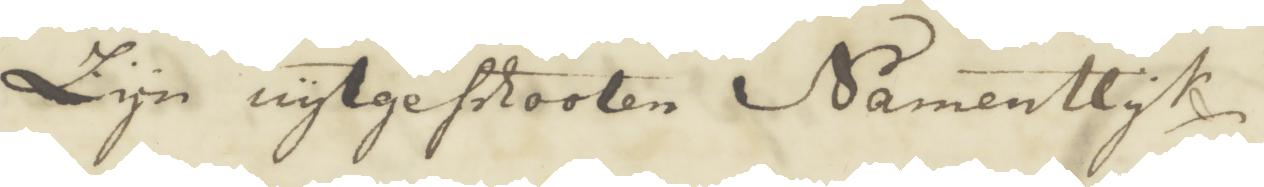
zijn uijtgeschooten Namentlijk
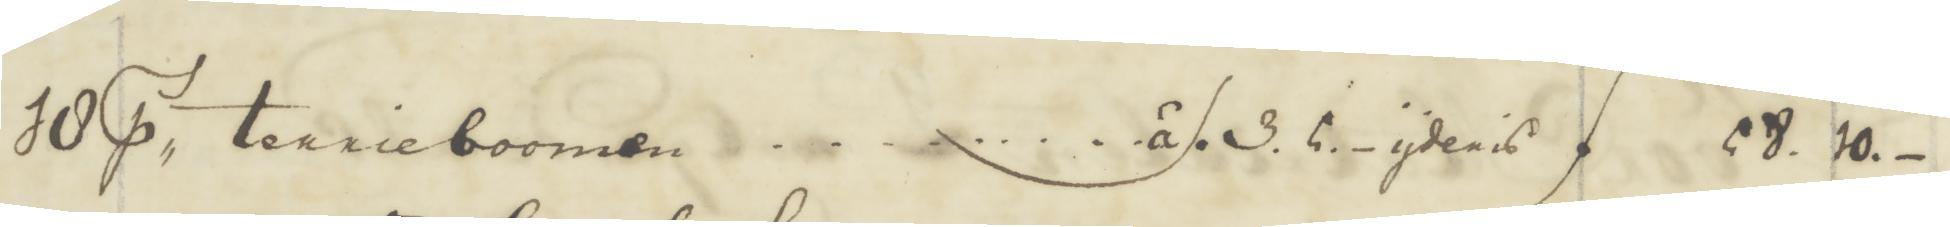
18 p„s terrieboomen - - - - - - - - - â ƒ 3. 5. — ijder is ƒ 58. 10. —
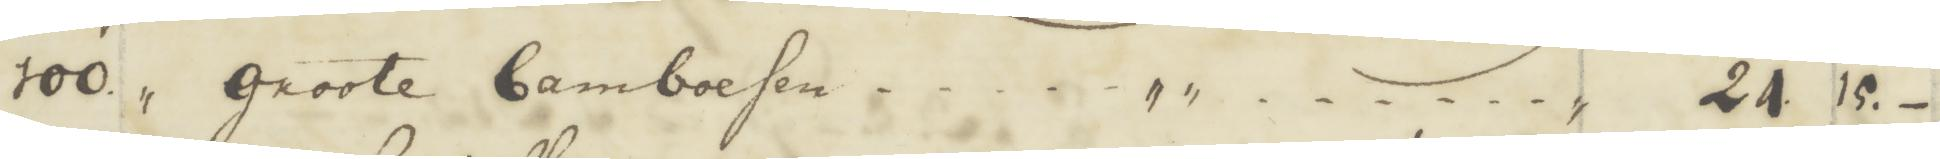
100. „ groote bamboesen - - - - - „ „ - - - - - - „ 24. 15. —
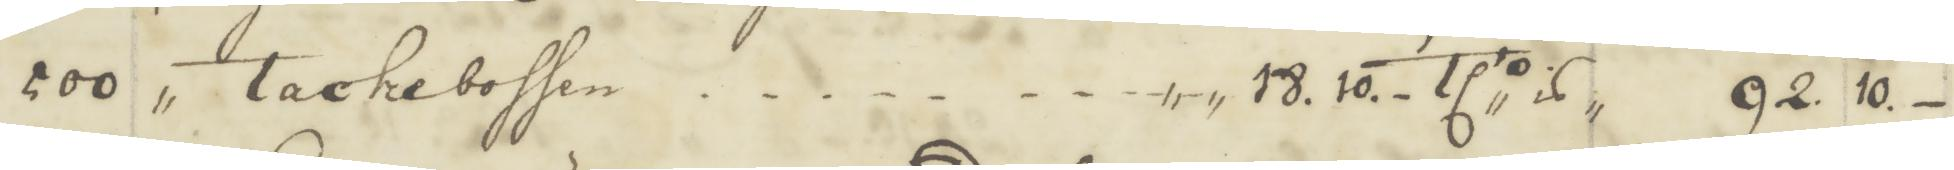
500 „ tackebossen - - - - - - - - - „ - „ 18. 10. — 'T C„to is „ 92. 10. —
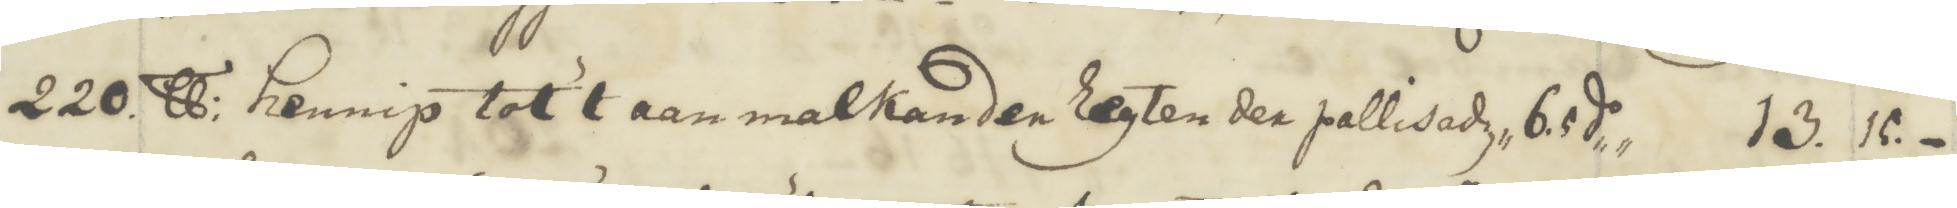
220. lb: hennip tot ’t aan malkander hegten der pallisaden „ 6. 5 d„o „ 13. 15. —
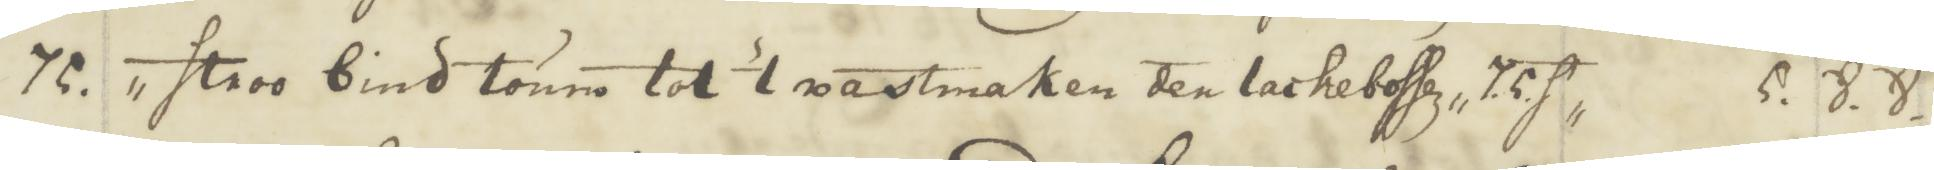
75. „ stroo bindtouw tot ’t vastmaken der tackebossen „ 7. 5. st „ 5. 8. 8.
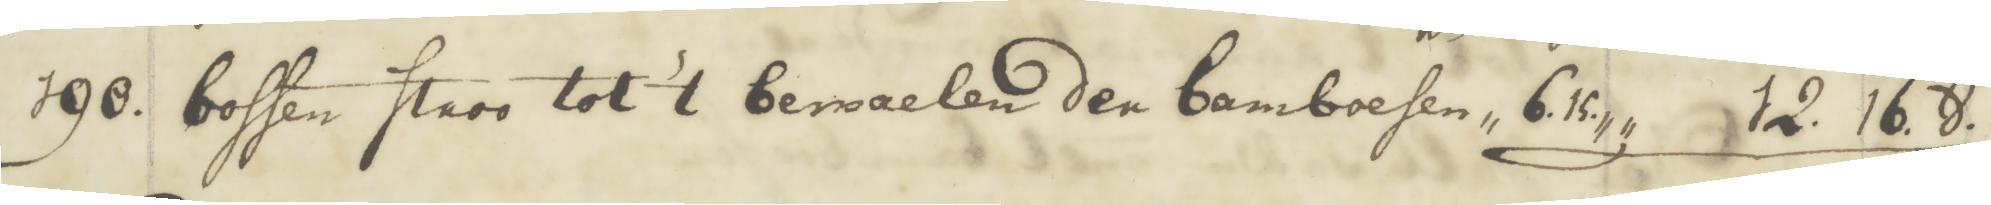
190. bossen stroo tot ’t bewaelen den bamboesen „ 6. 15. „ „ 12. 16. 8.
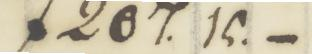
ƒ 207. 15. —
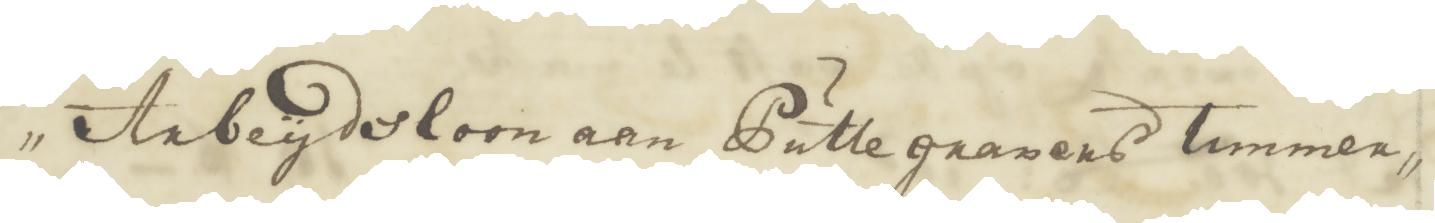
V„n Arbeijdsloon aan Puttegravers timmer„
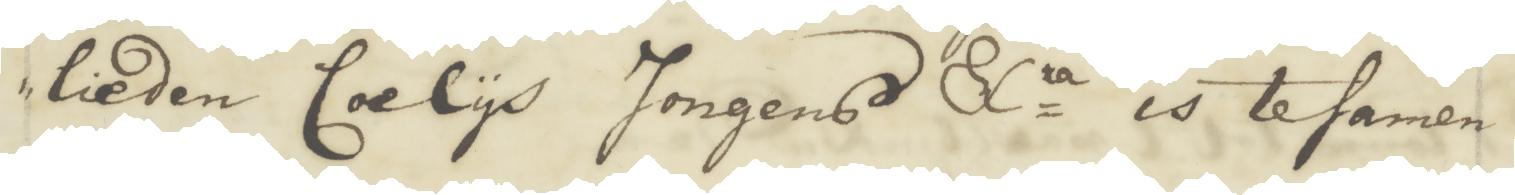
„lieden Coelijs Jongens &=ra is te samen
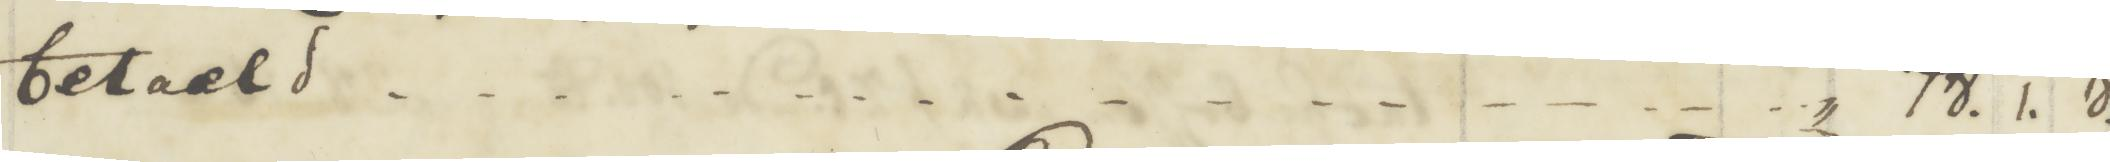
betaeld - - - - - - - - - - - - - - - - - - - „ 78. 1. 8.
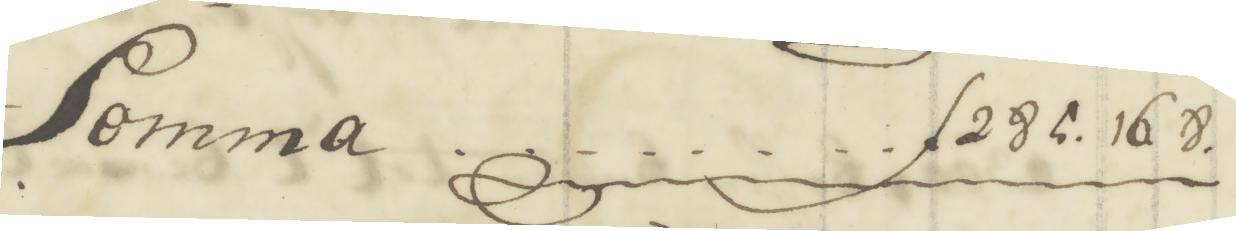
Somma - - - - - - - - ƒ 285. 16. 8.
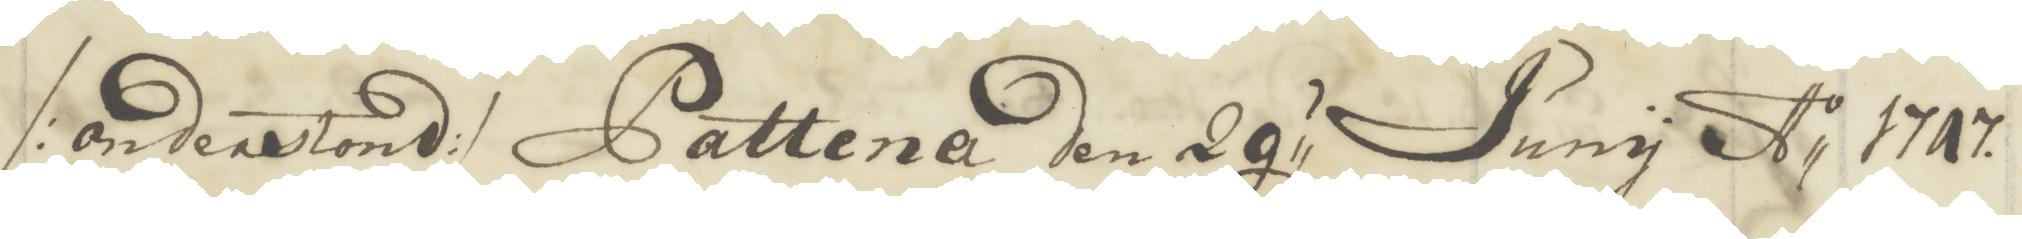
/: onderstond :/ Pattena den 29„' Junij A„o 1747.
